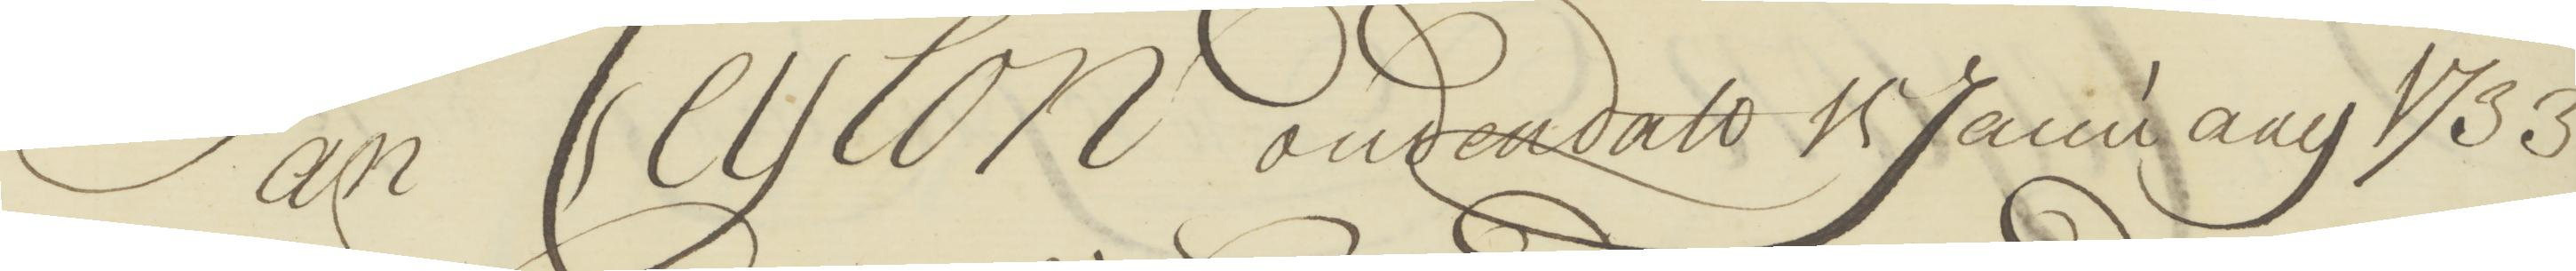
Van Ceijlon onderdato 15 January 1733
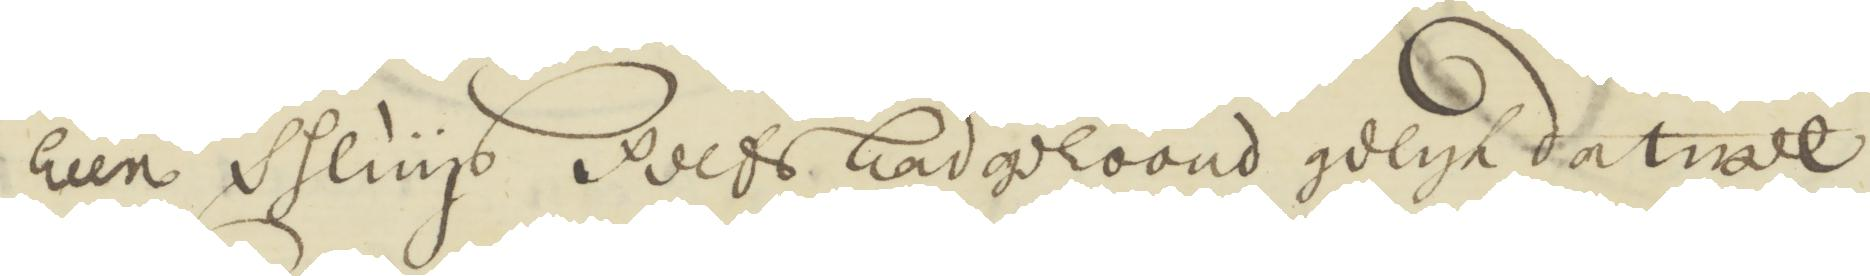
heer versluijs selfs had gehoord gelyk dat wel
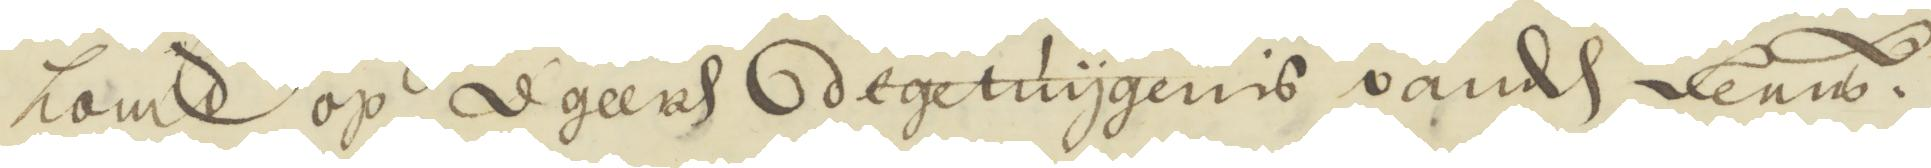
komd op te geeven de getuijgenis vanden Eerw:
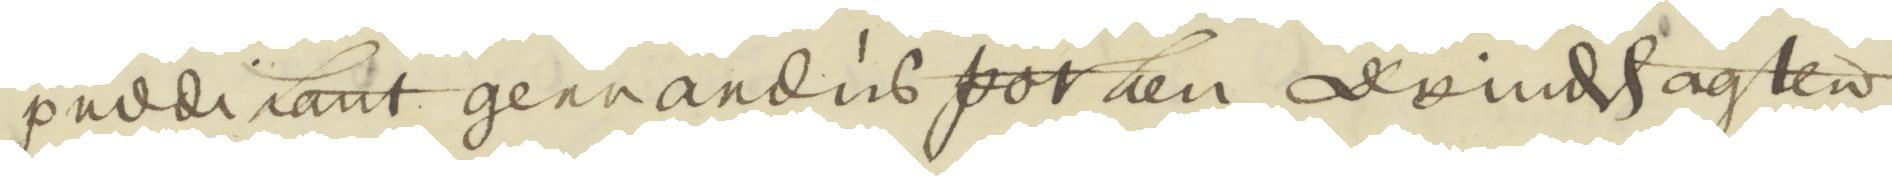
predikant gerrardus potken tevinden agter
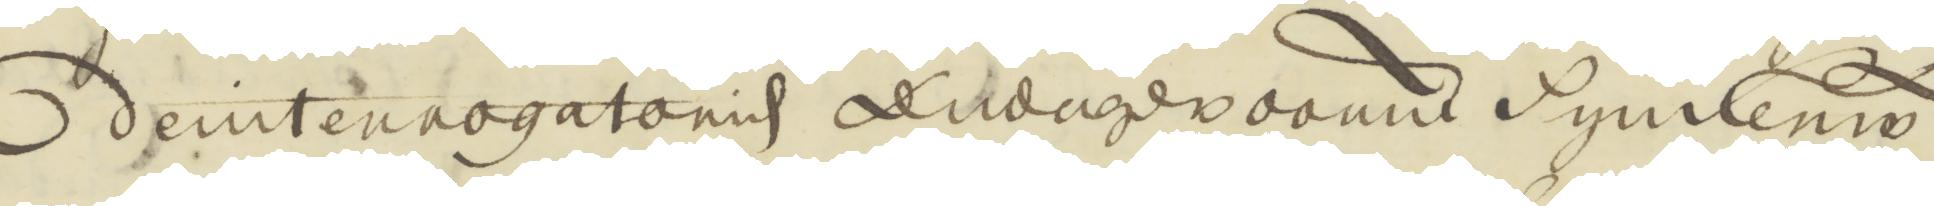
de interrogatorien ten dage voorm Syn Eerw
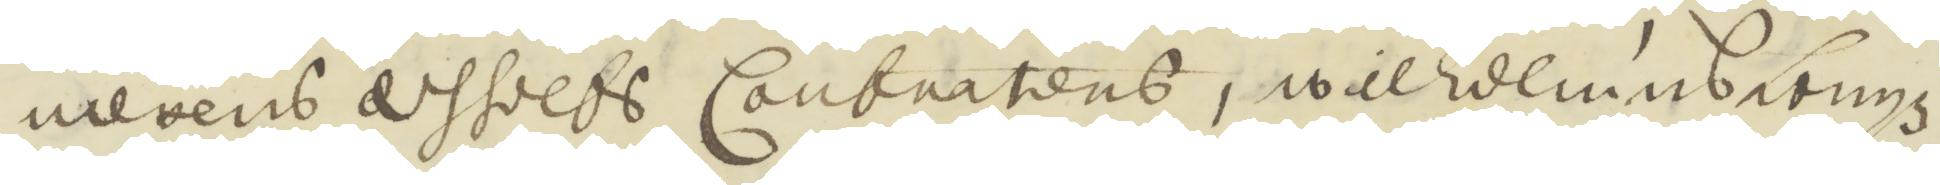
nevens desselfs Confraters, wilhelmus konyn
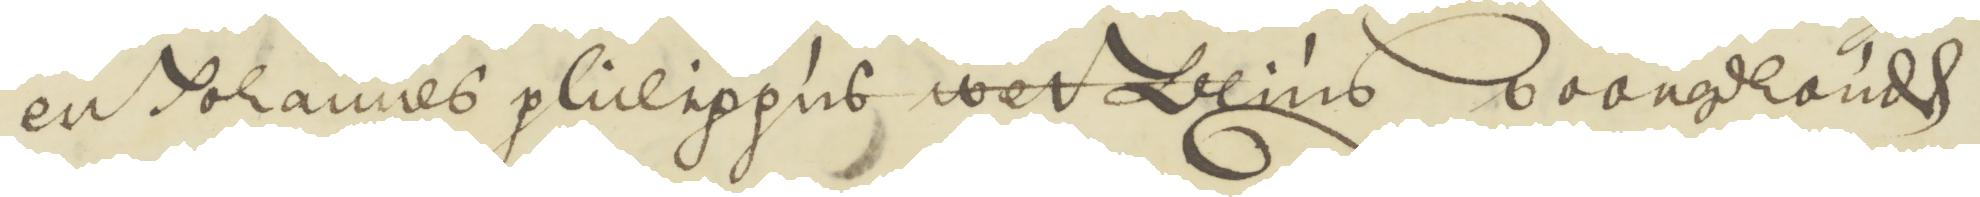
en Iohannes philippus wetzlius voorgehouden
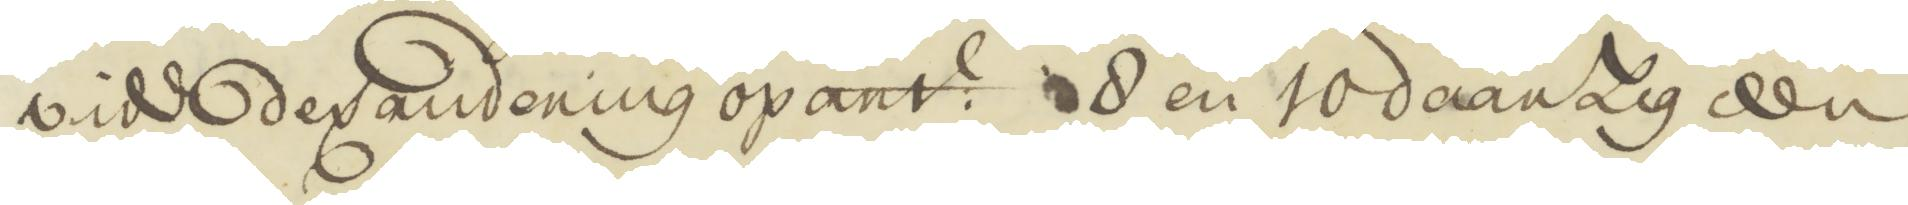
vide de verandering op art:l 18 en 10 daar Zig den
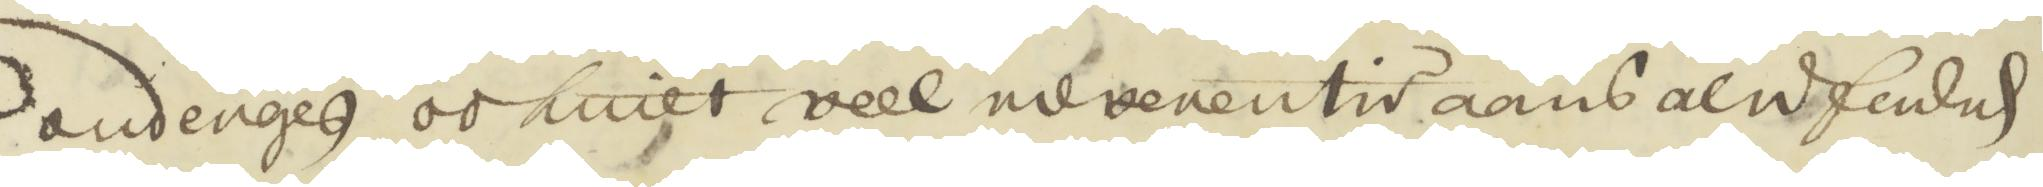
onderges ook niet veel reverentie aan sal refereren
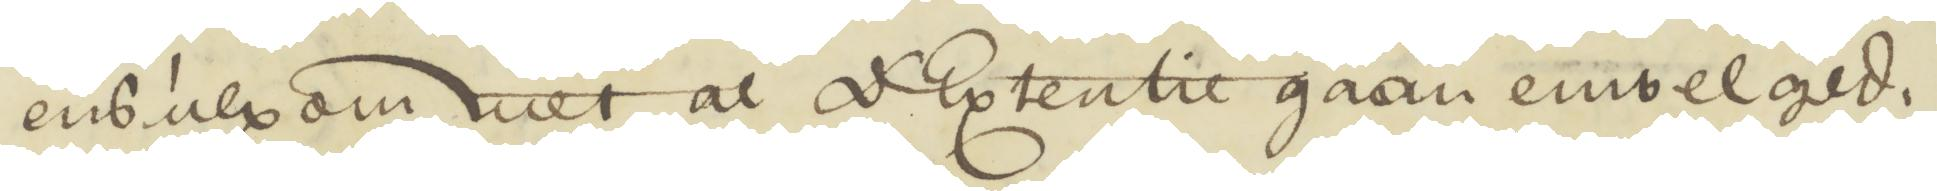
en sulx om niet al te Extentie gaan en wel ged.
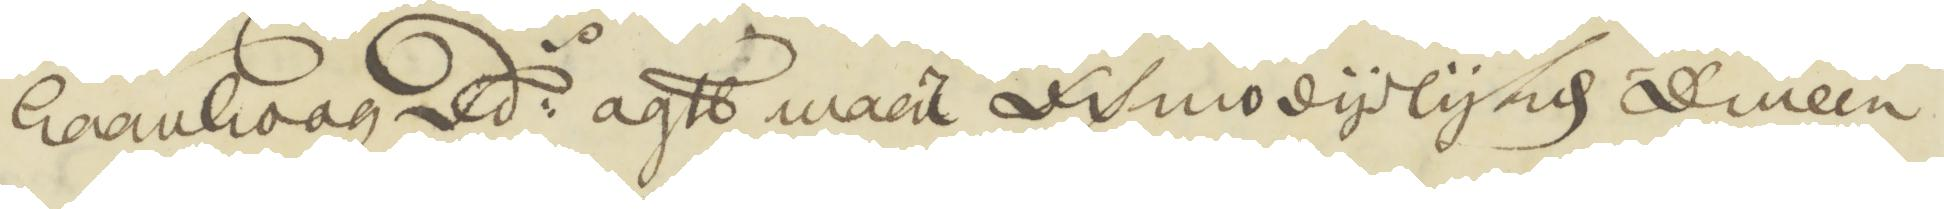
haar hoog Ed:s agtb maar te vermoeijelijken te meer
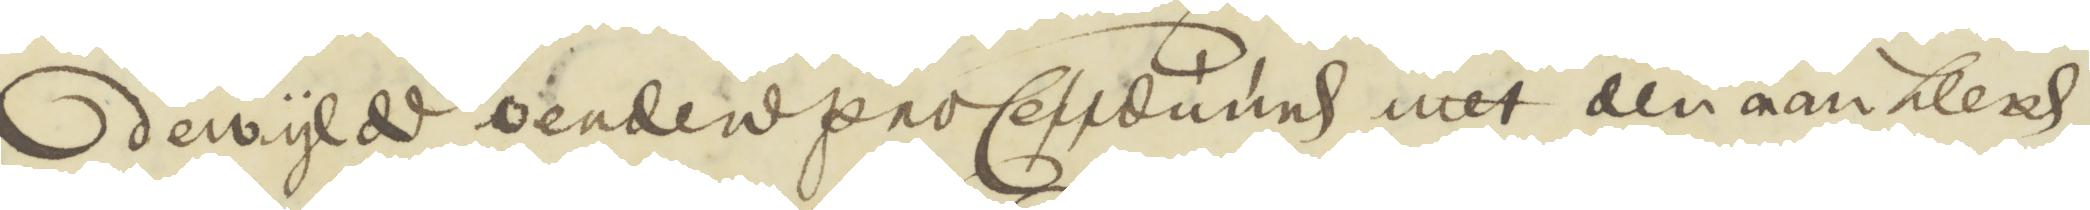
dewijl de verdere processduuren met den aan kleven
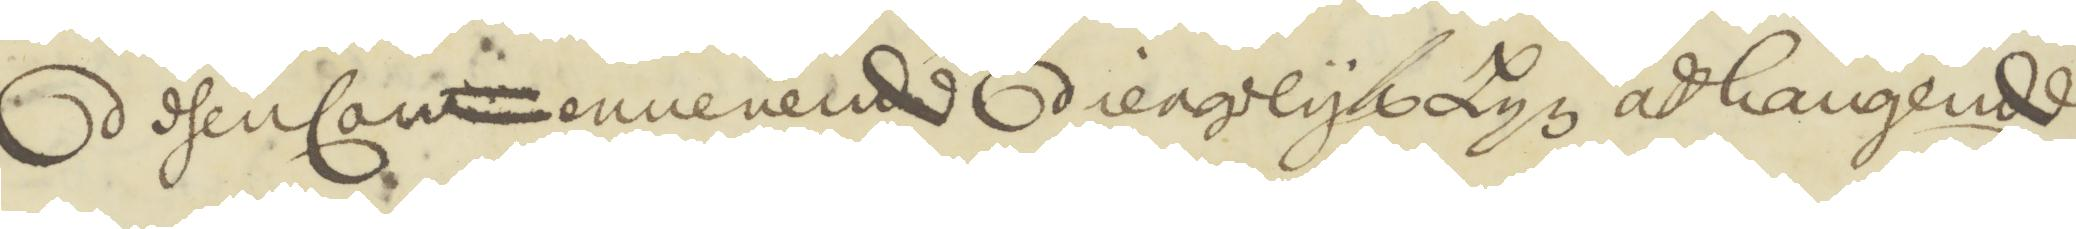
desen Concernerende diergelijk Zyn afhangende
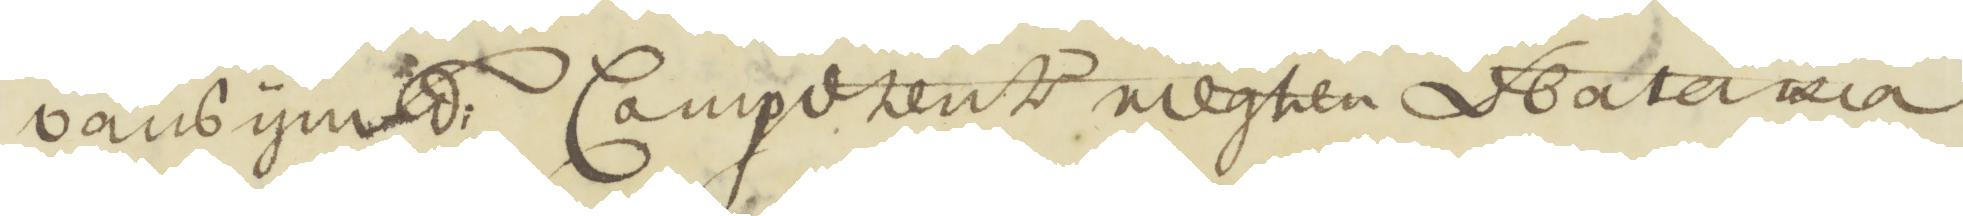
van sijn Ed: Competente regten te batavia
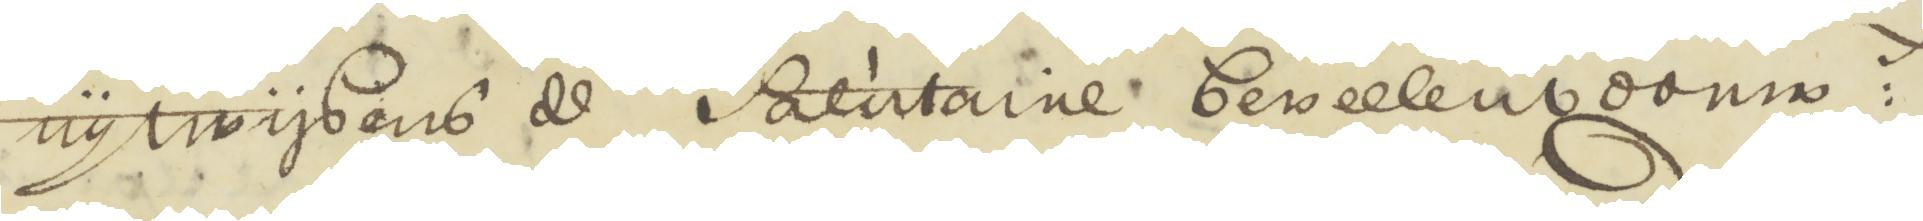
uijtwijsens de solutaire beveelen voorw:s
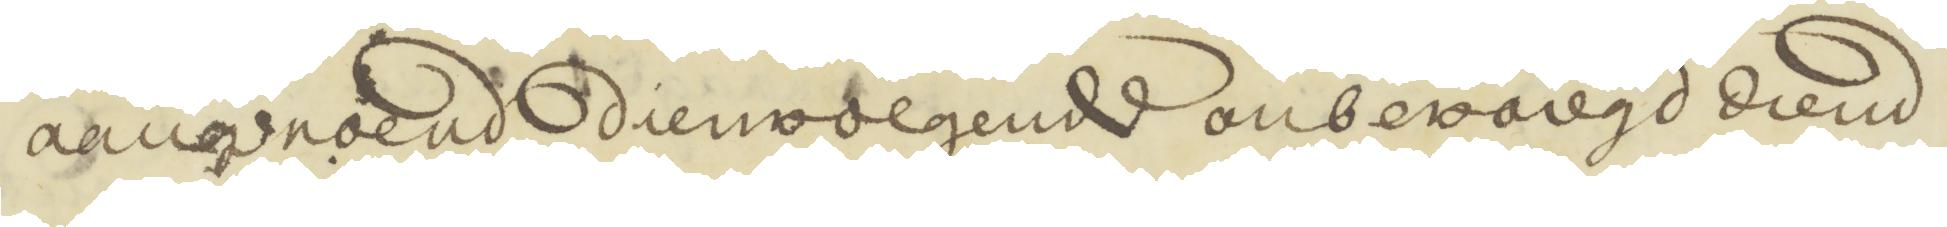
aangeroerd dienvolgende onbevoegd diend
